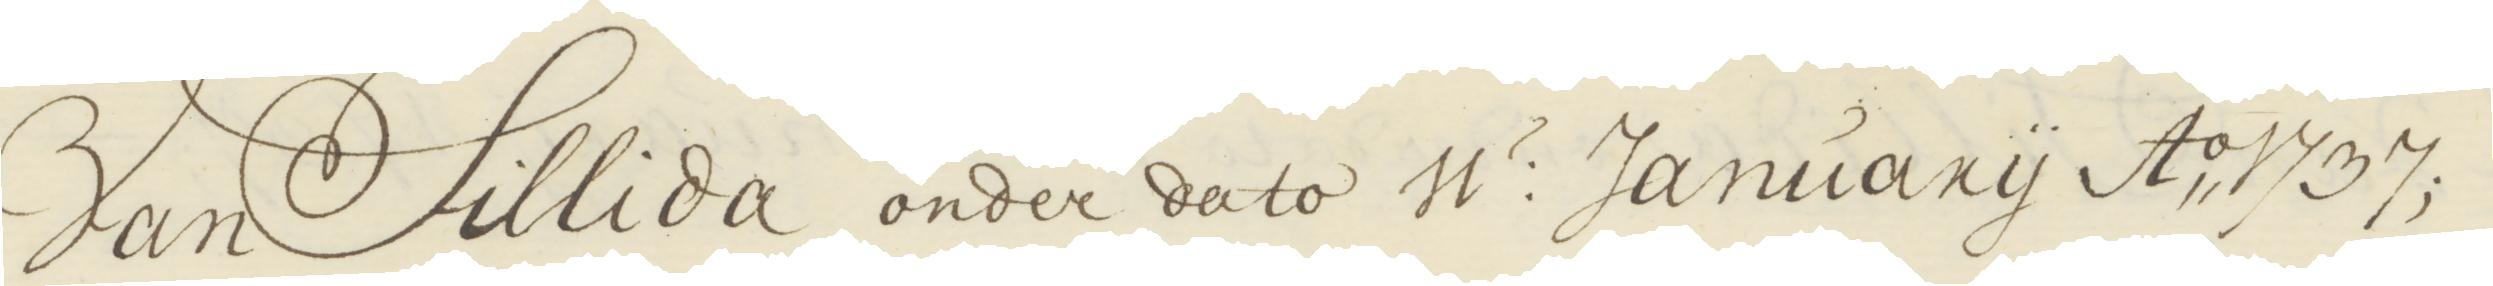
Van Sillida onder dato 11': Januarij A„o 1737;
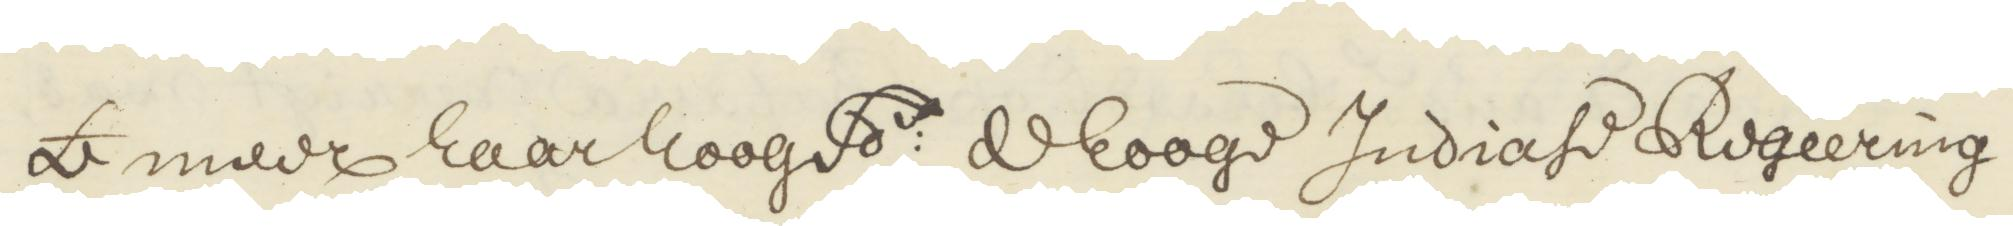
te meer haar hoog Ed:s de hooge Indiase Regeering
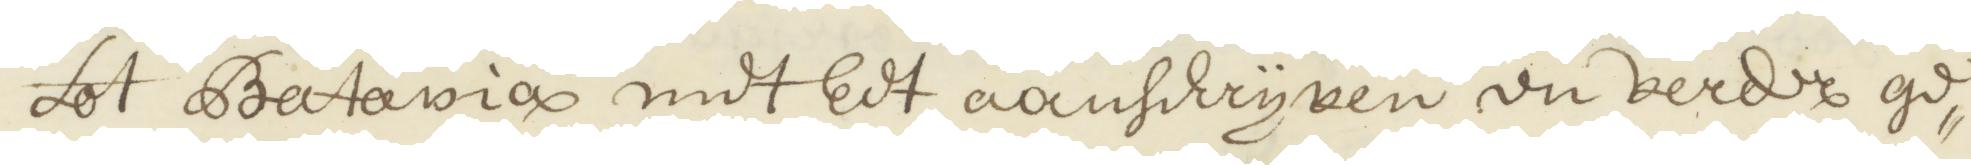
tot Batavia met het aanschrijven en verder ge„
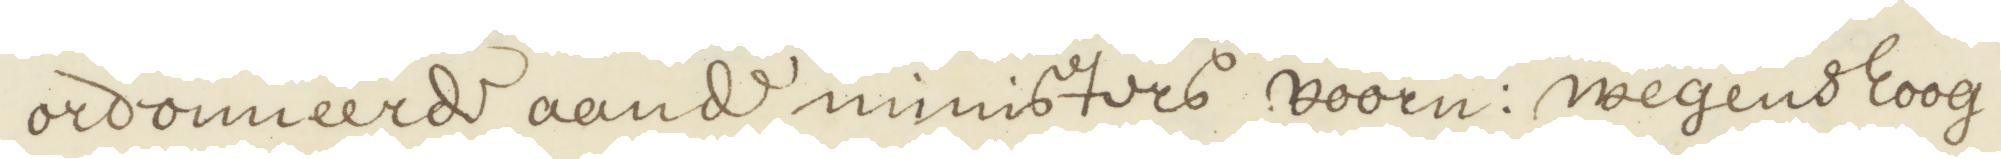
ordonneerde aande ministers voorn: wegens hoog
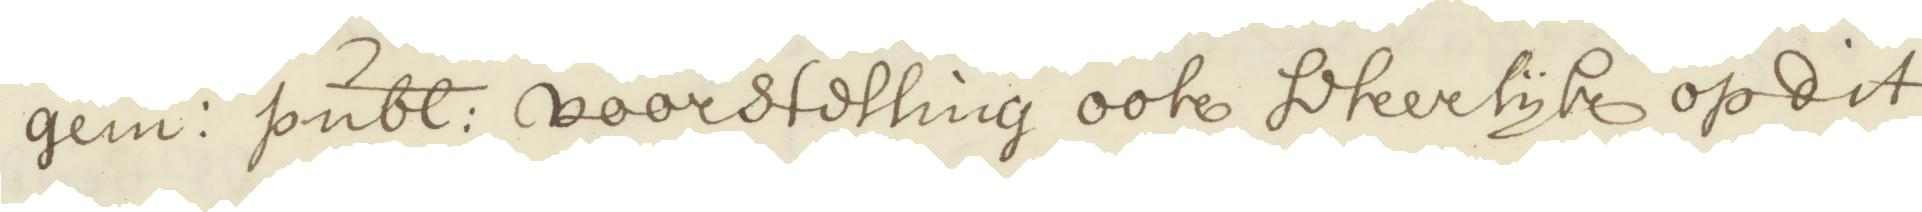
gem: publ: voorstelling ook sekerlijk op dit
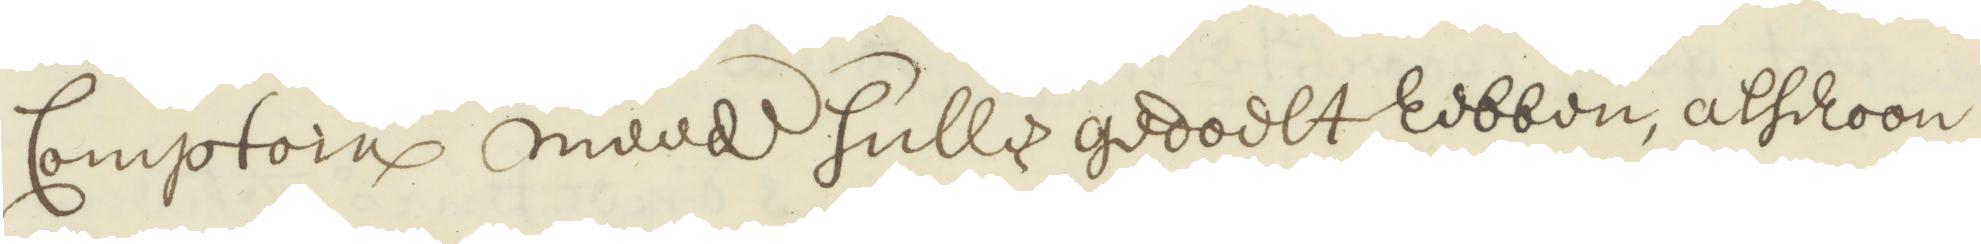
comptoir meede sulle gedoelt hebben, alschoon
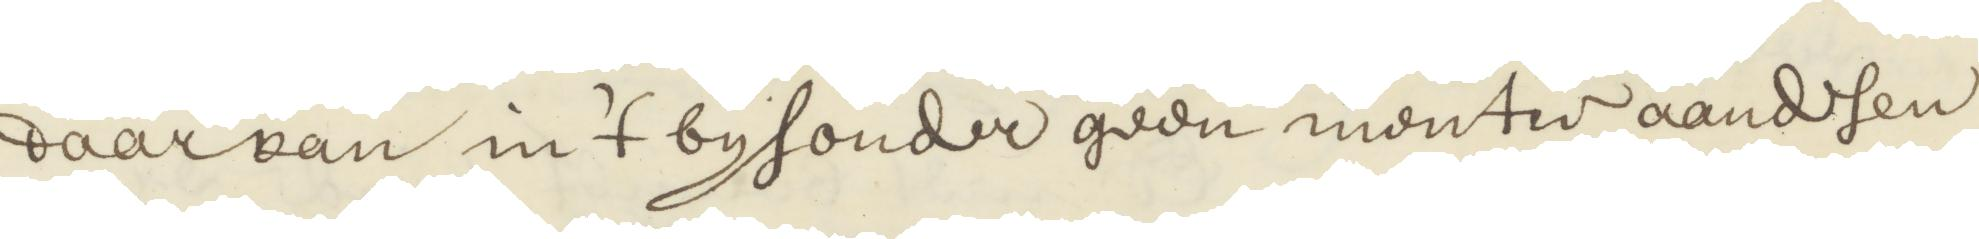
daar van in ’t bijsonder geen mentie aandesen
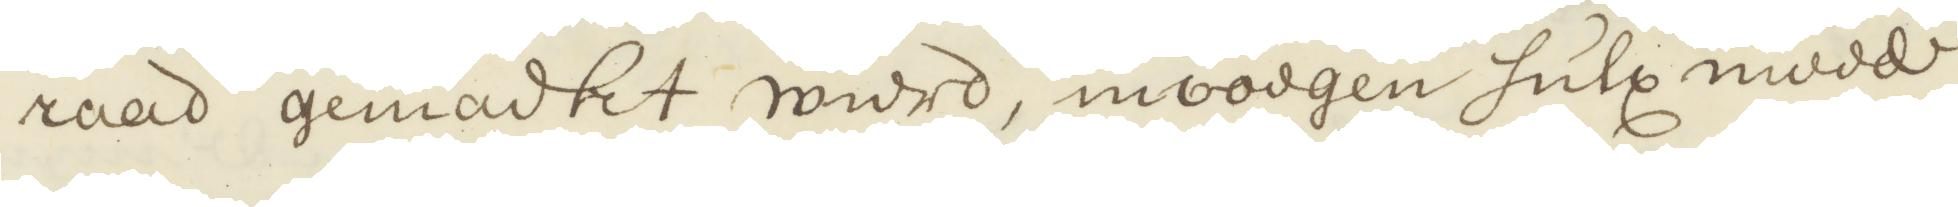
raad gemaekt wierd, invoegen sulx meede
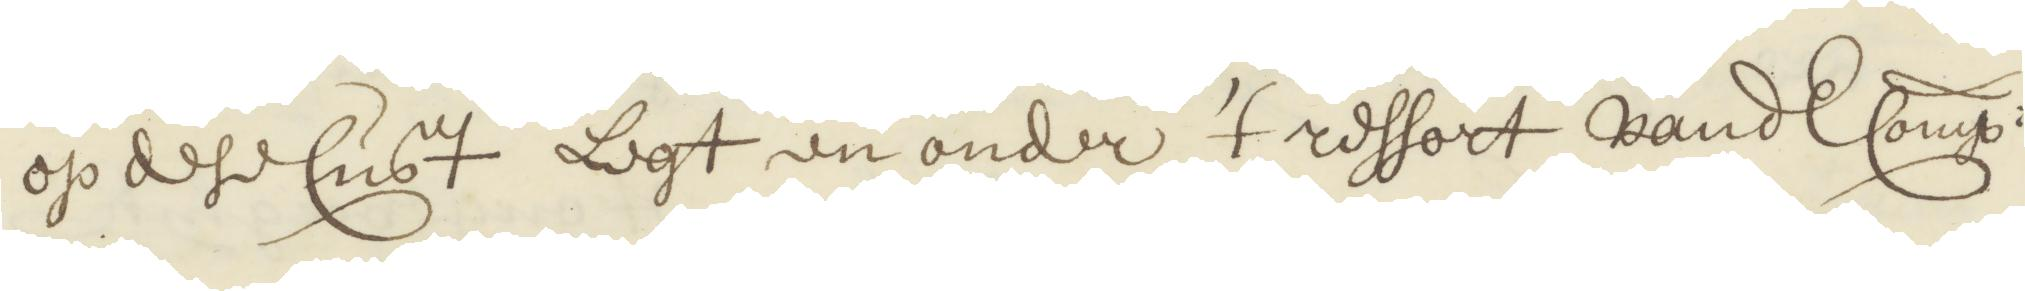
op dese Cust Legt en onder ’t ressort van dE Comp:
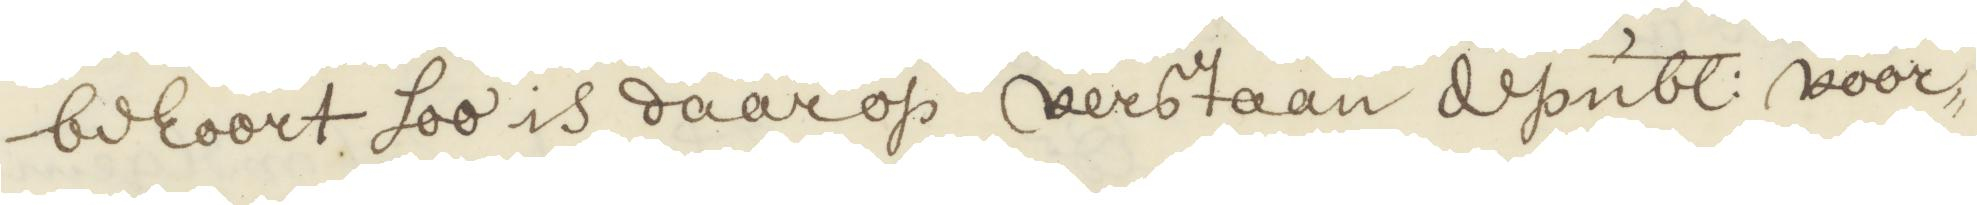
behoort soo is daarop verstaan de publ: voor„
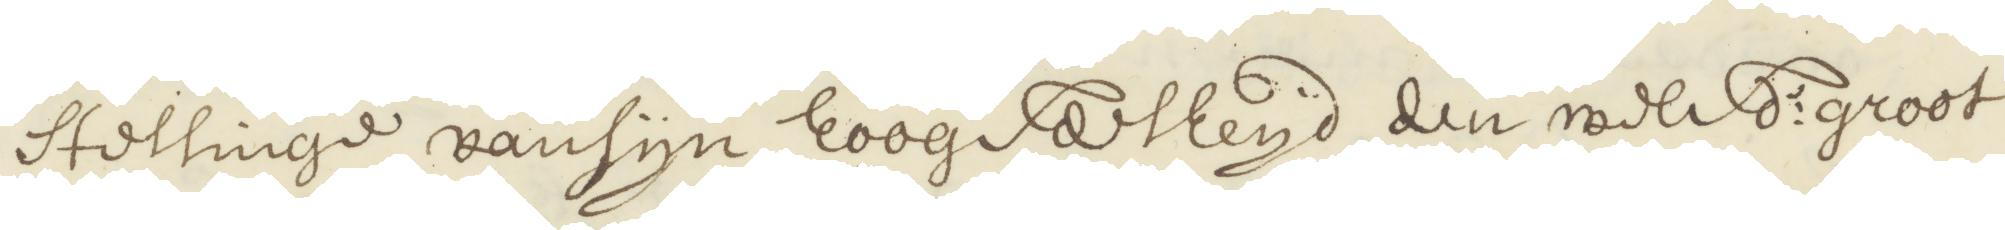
stellinge van sijn hoog Edelheijd den wel Ed:s groot
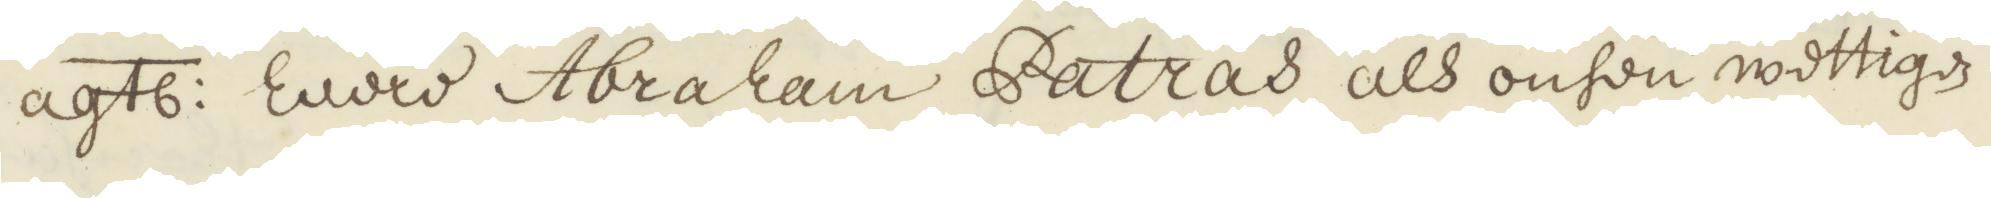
agtb: heere Abraham Patras als onsen wettigen
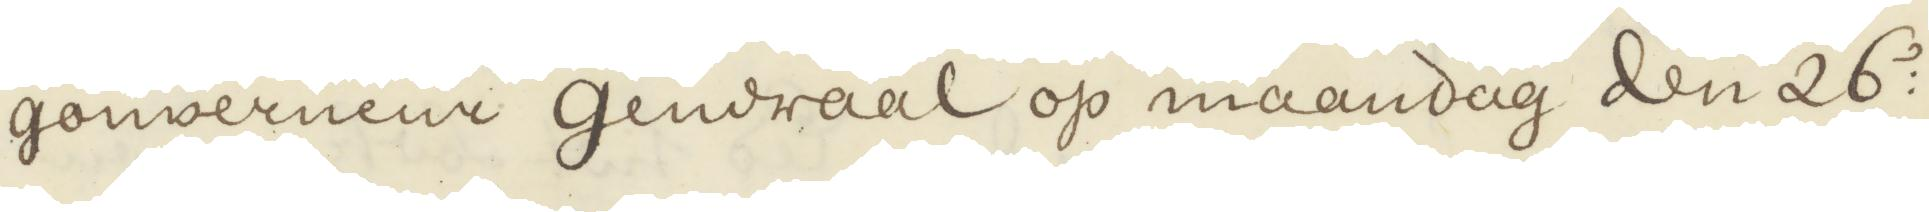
gouverneur generaal op maandag den 26':
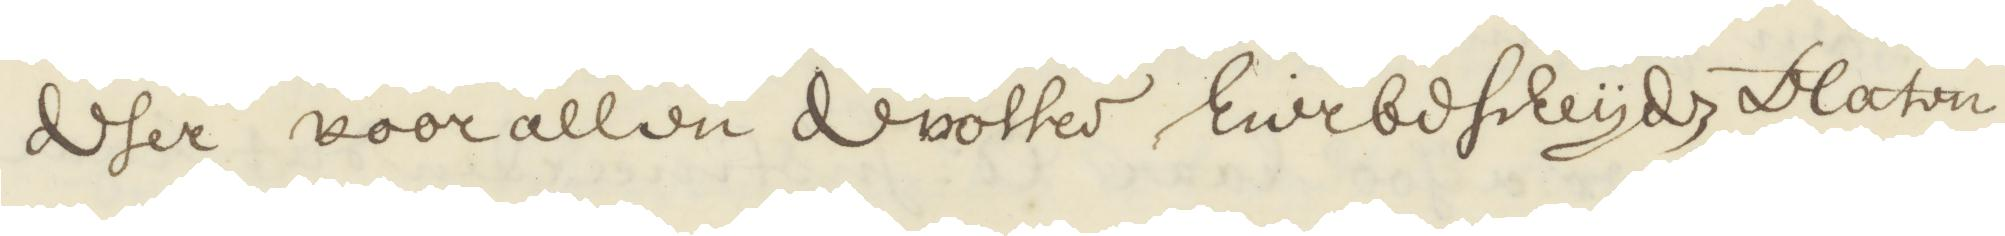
deser voor allen de volke hierbescheijden telaten
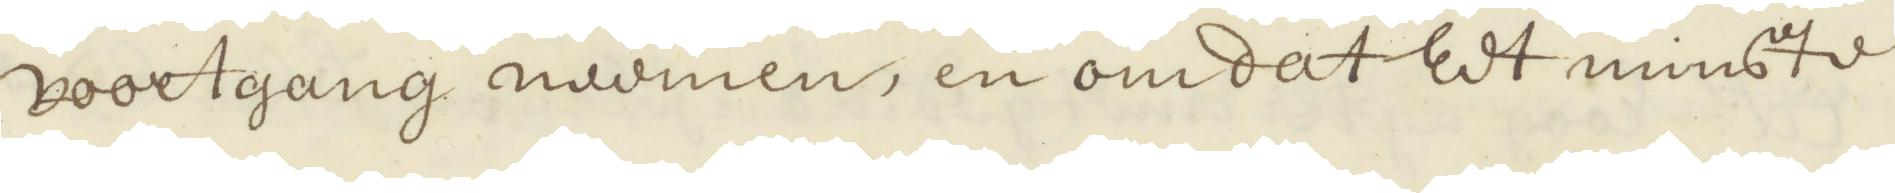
voortgang neemen, en omdat het minste
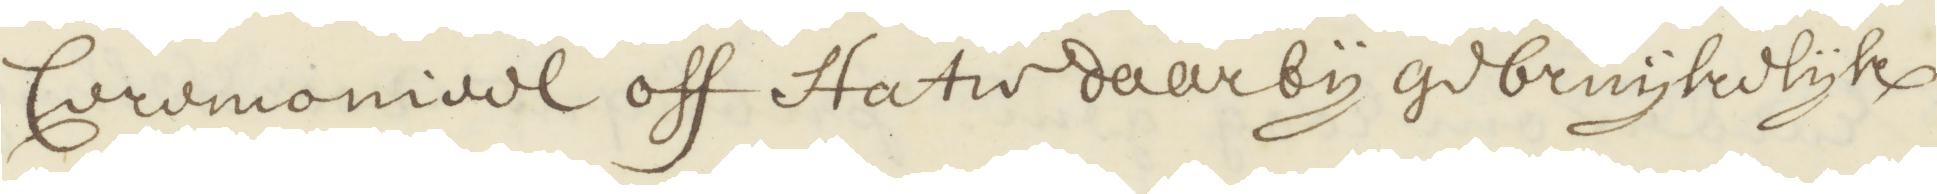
ceremonieel off statie daarbij gebruijkelijk
